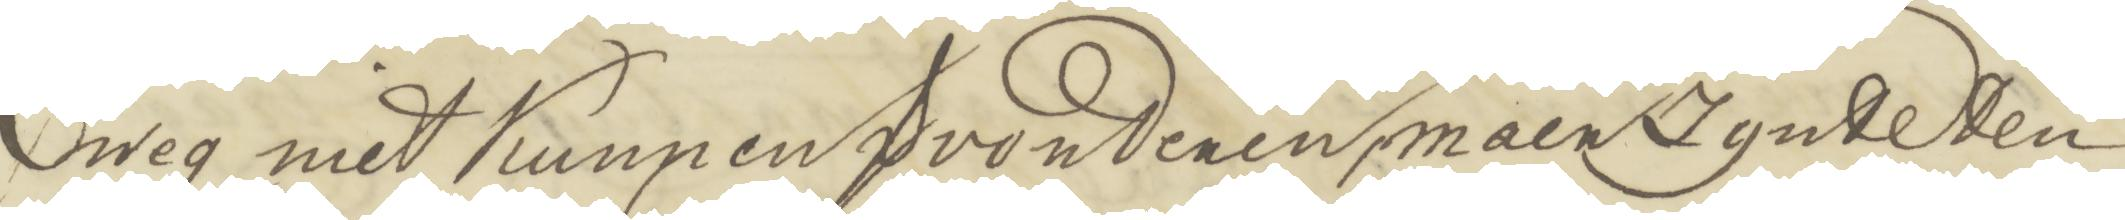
weg niet Kunnen vervorderen, maer Zijn te den
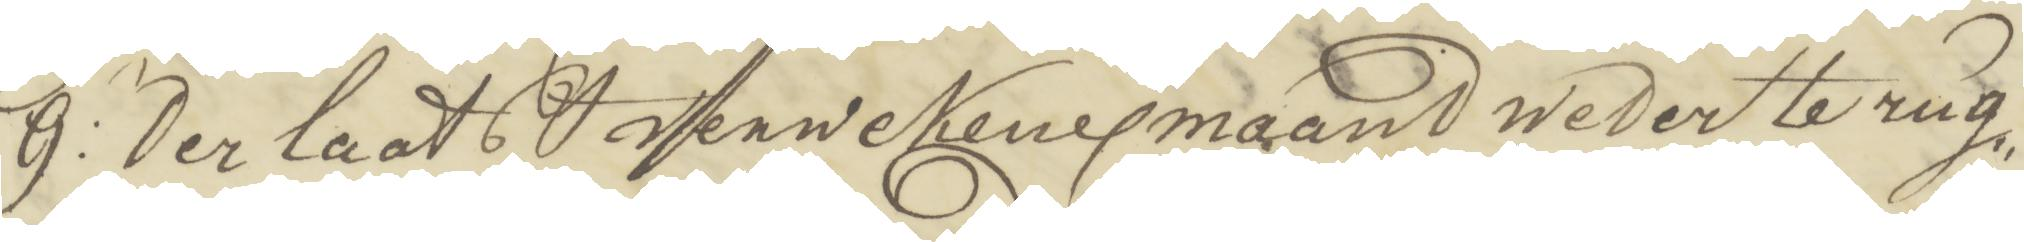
9: der laatst verwekene maand weder terug„
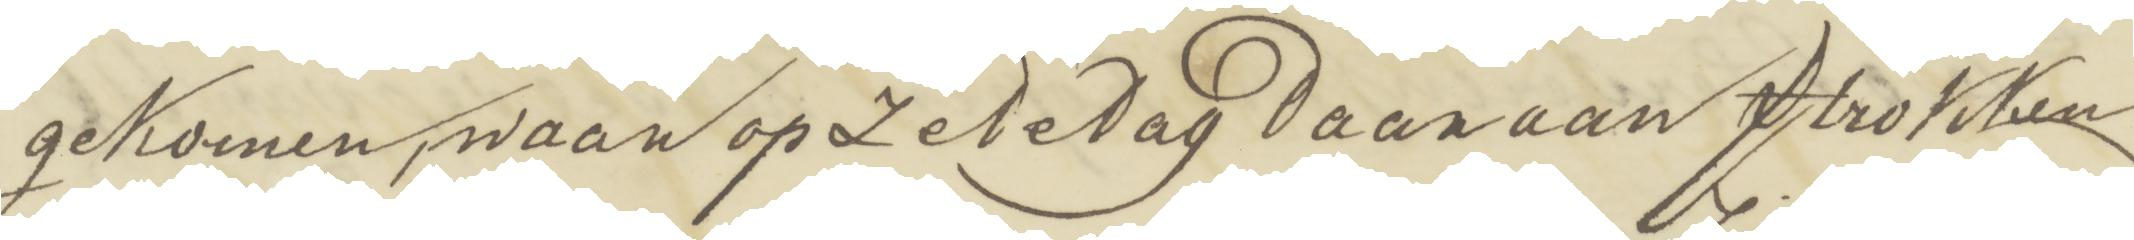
gekomen, waar op ze de dag daaraan vertrokken
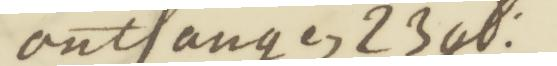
ontfang en 23 9b:
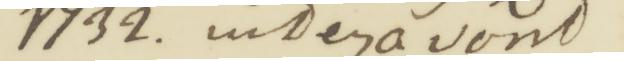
1732. in den avond
